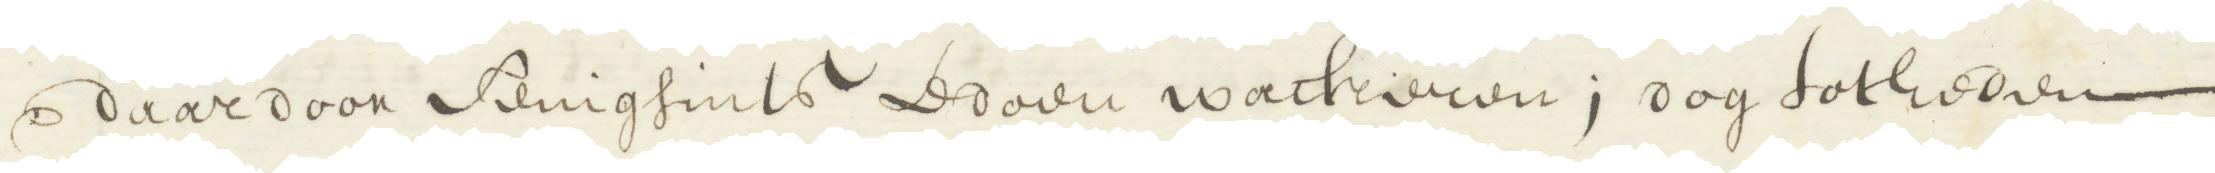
daar door Eenigsints te doen wackeren; dog totheden
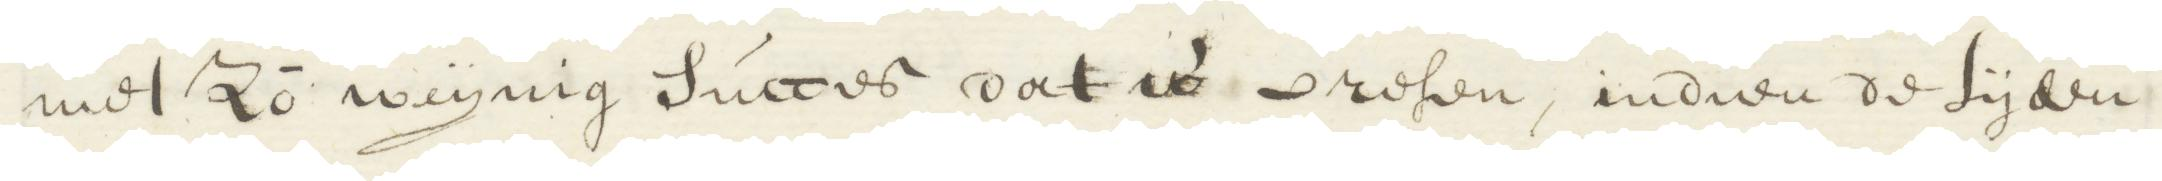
met zo weijnig succes dat is vresen, indien de tijden
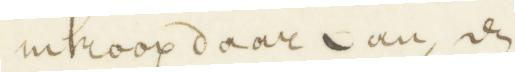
inkoop daar van, en
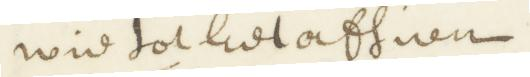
wie tot het afsien
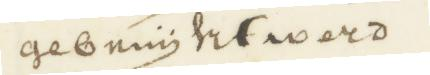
gebruijkt werd
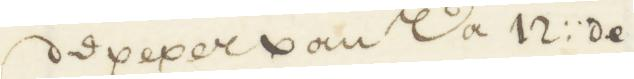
de peper van ro/a 12: de
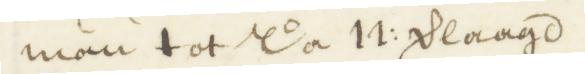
man tot ro/a 11: verlaagd
